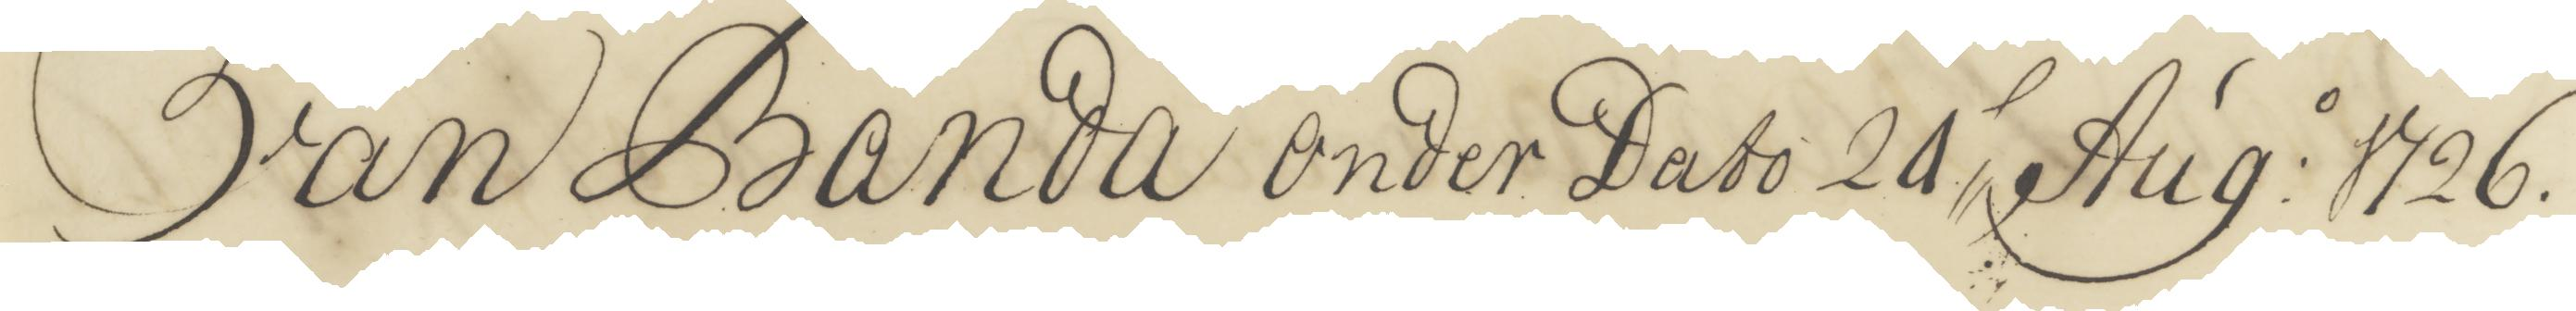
Van Banda onder Dato 24„' Aug:o 1726.
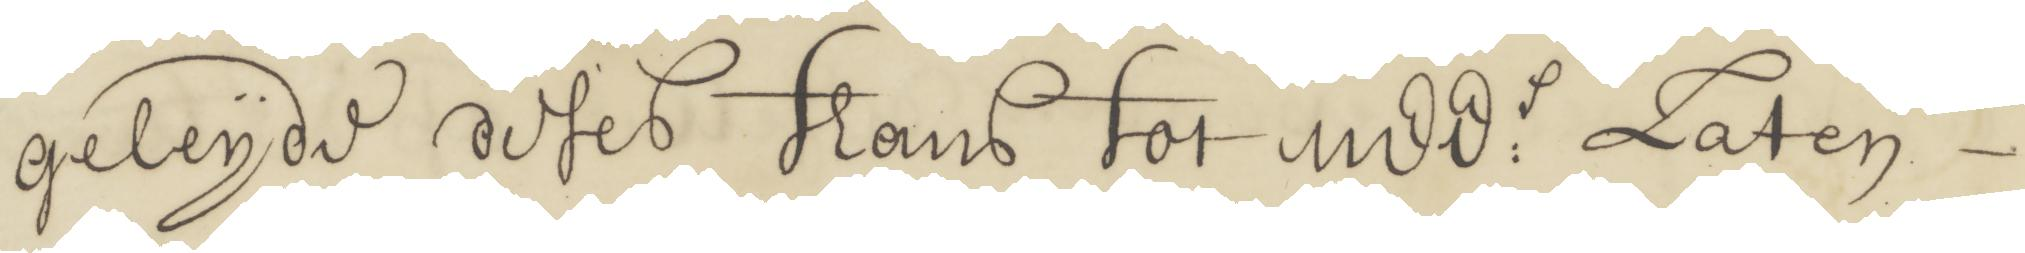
geleijde deses thans tot uEE:s Laten —
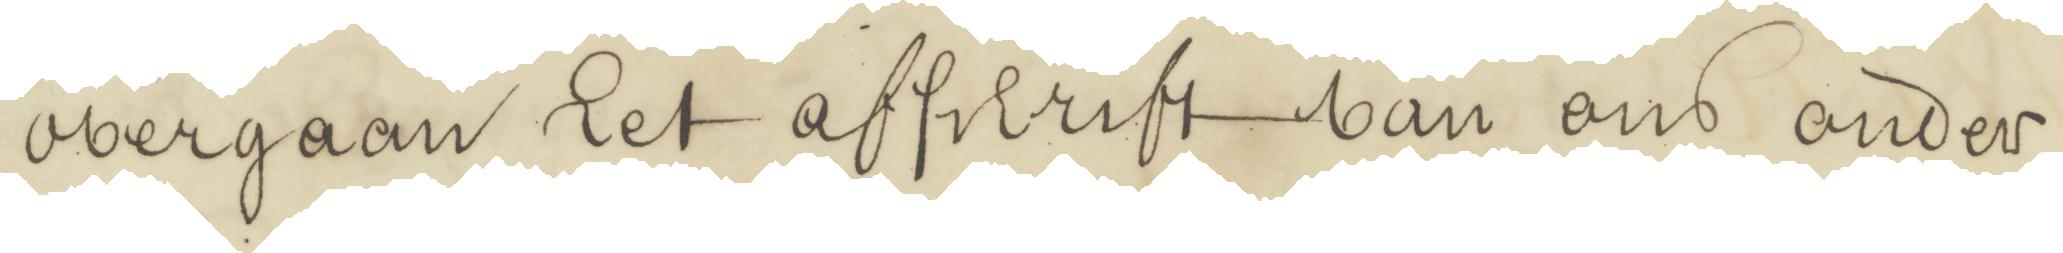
overgaan het afschrift van ons onder
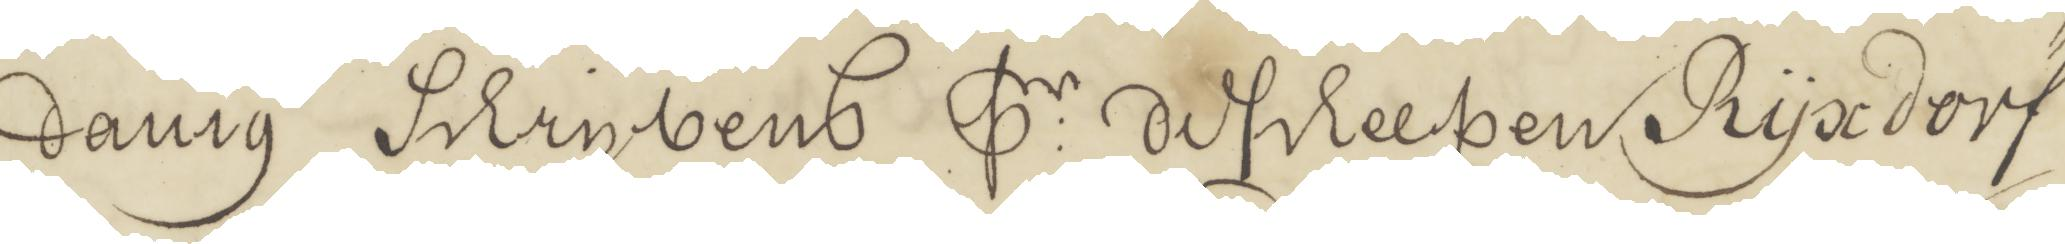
danig schrijvens p:r de scheepen Rijxdorf
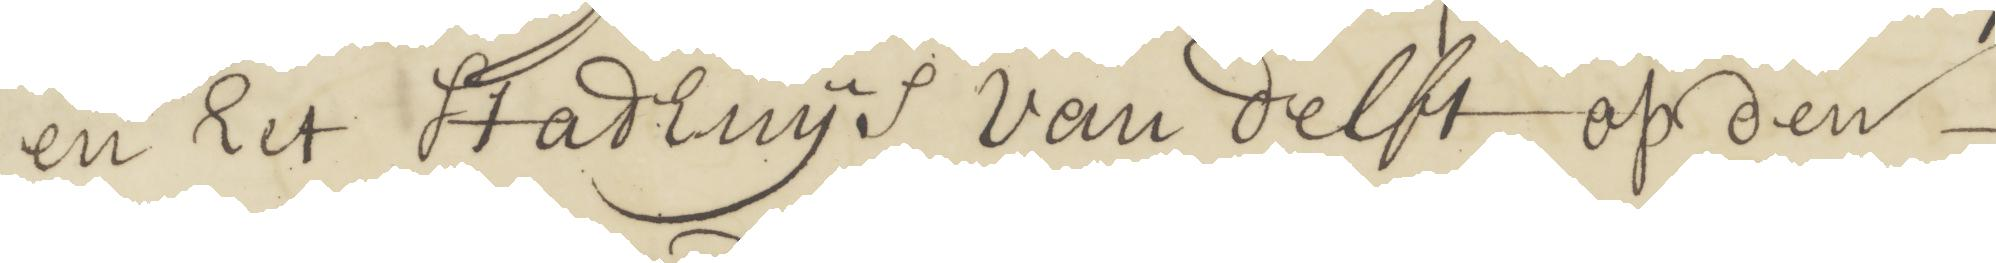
en het stadhuijs van delft, op den —
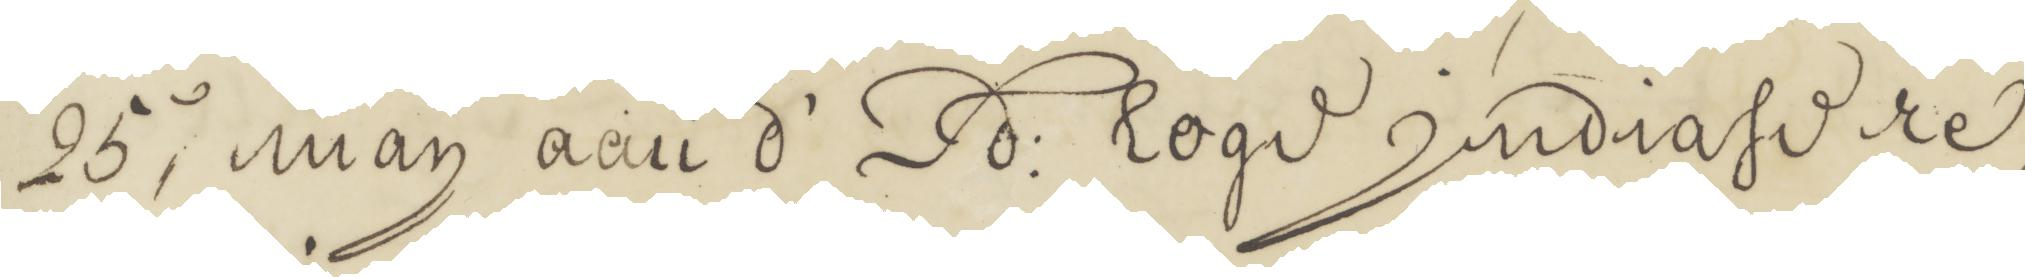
25„' maij aan d’ Ed: hoge jndiase re
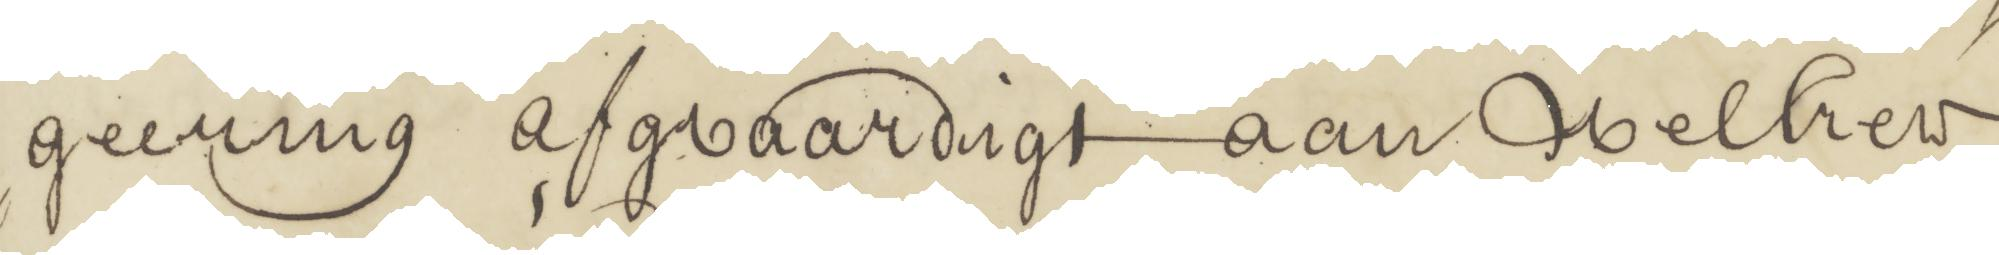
geering afgvaardigt aan welker
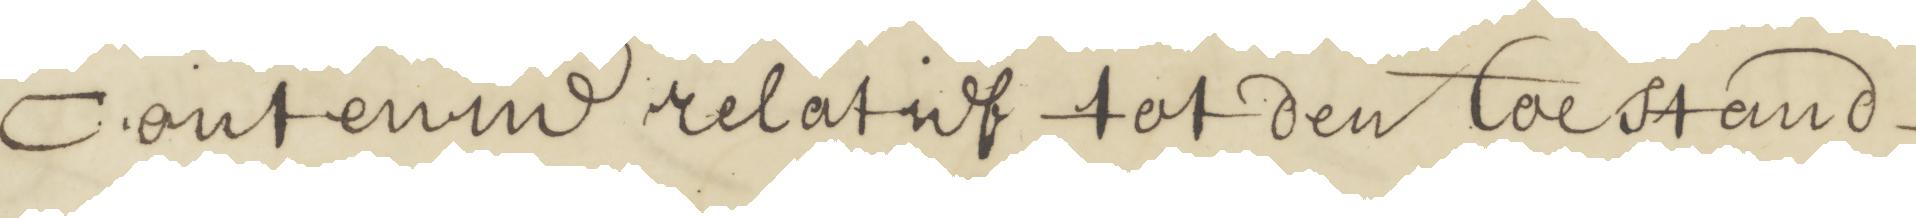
Contenue relatief tot den toestand
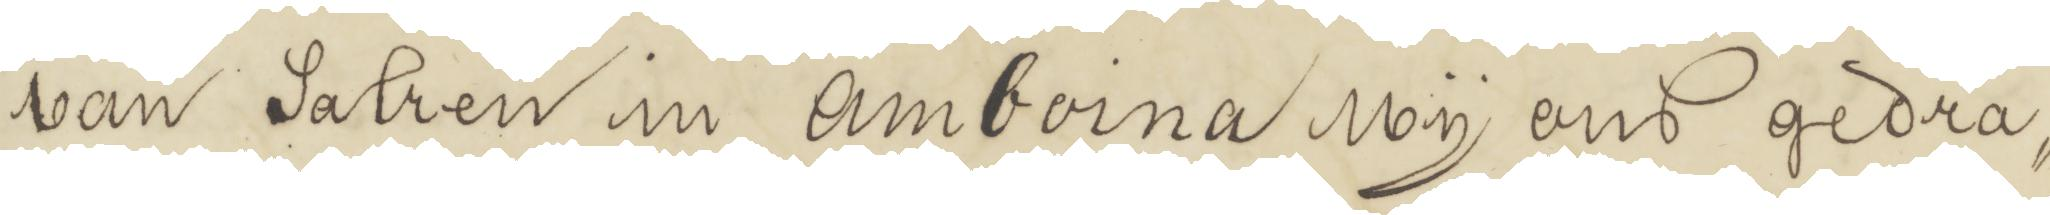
van Saken in Amboina wij ons gedra„
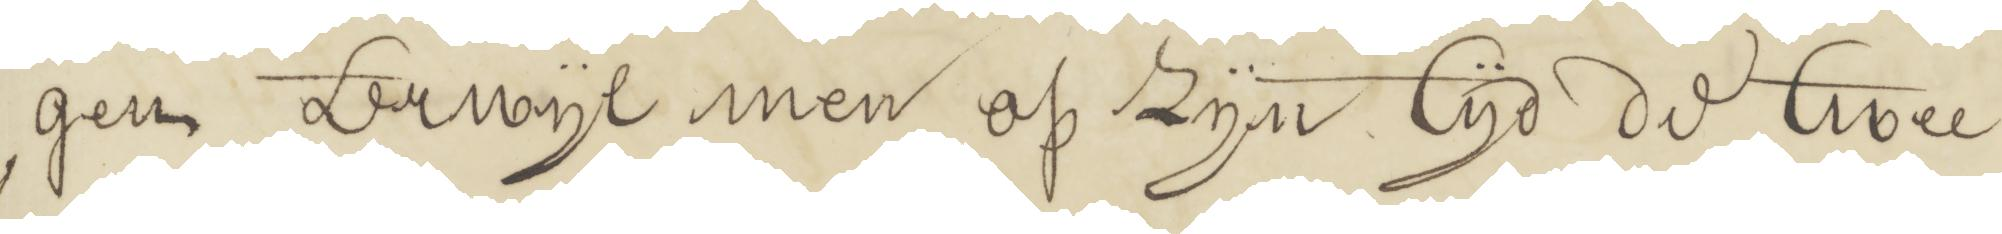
gen terwijl men op Zijn tijd de twee
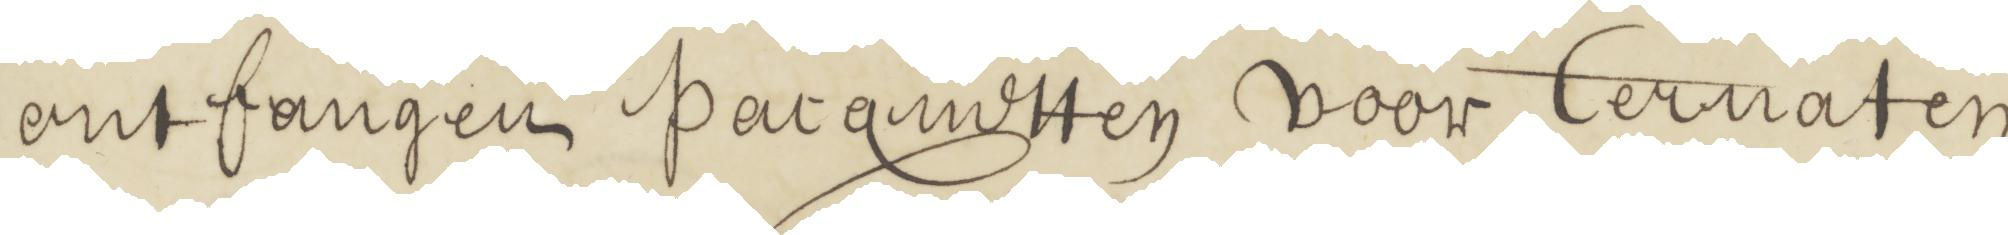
ontfangen pacquetten voor ternaten
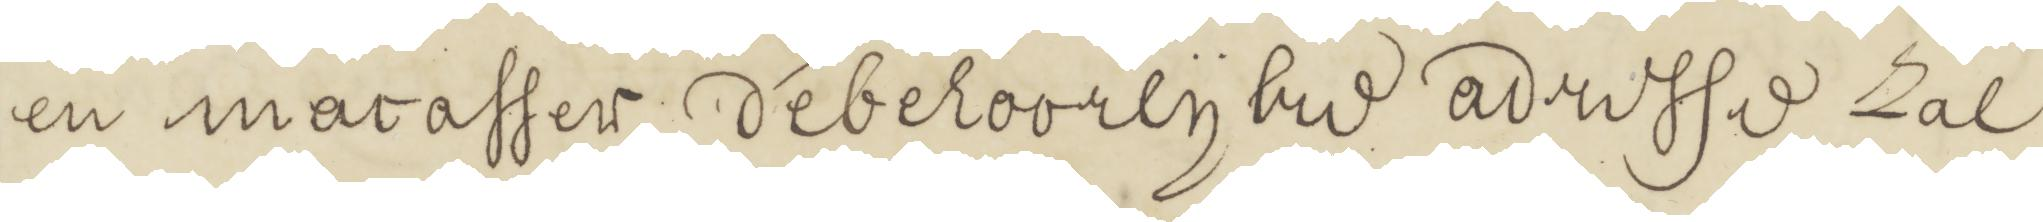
en macasser de behoorlijke adresse Zal
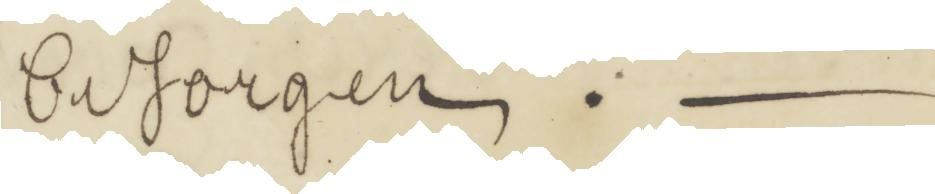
besorgen.-
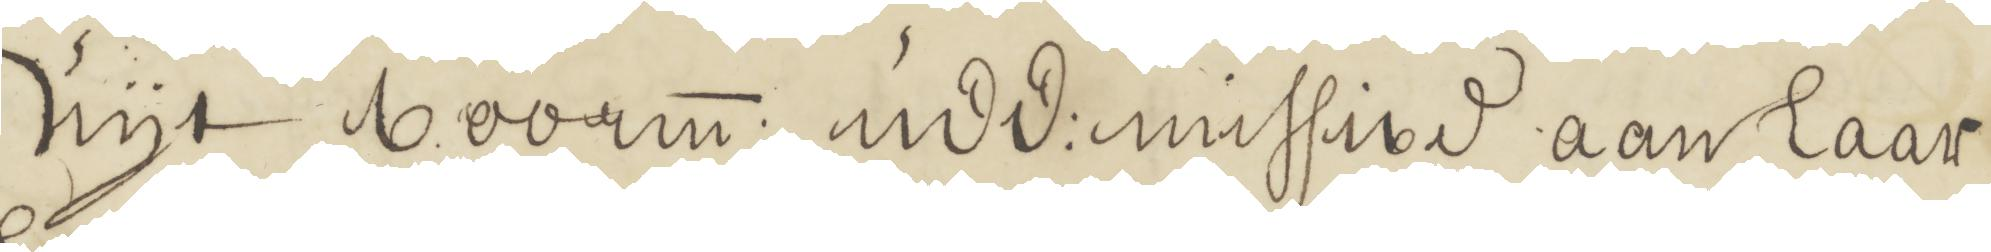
uijt voorm: uEE: missive aan haar
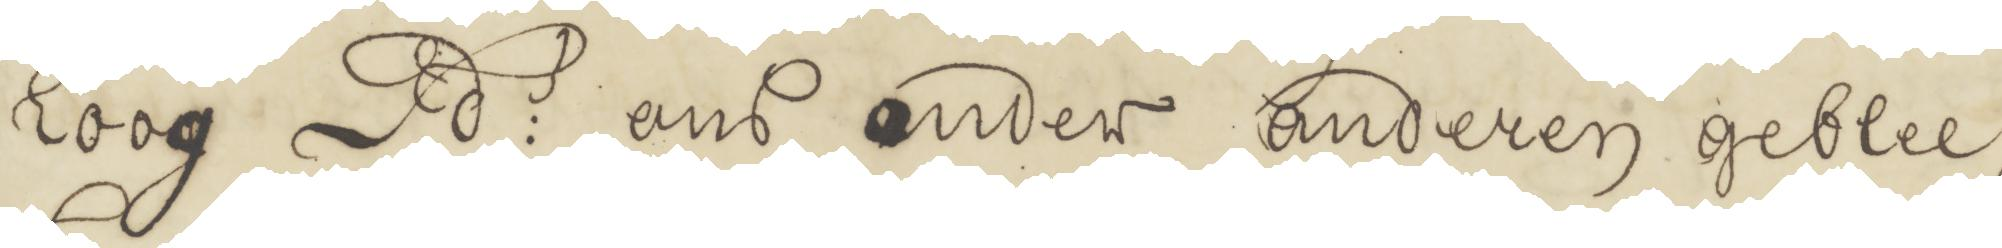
hoog Ed:s ons onder anderen geblee
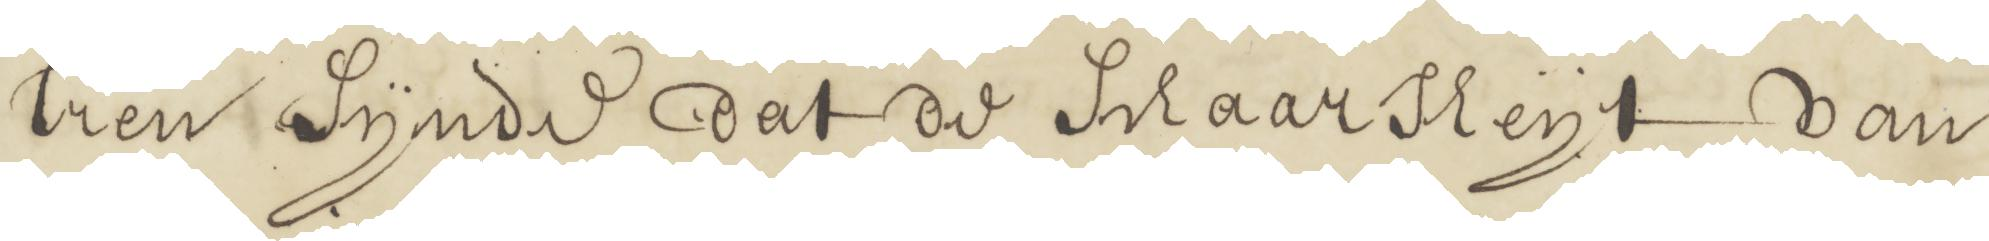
ken Sijnde dat de Schaarsheijt van
